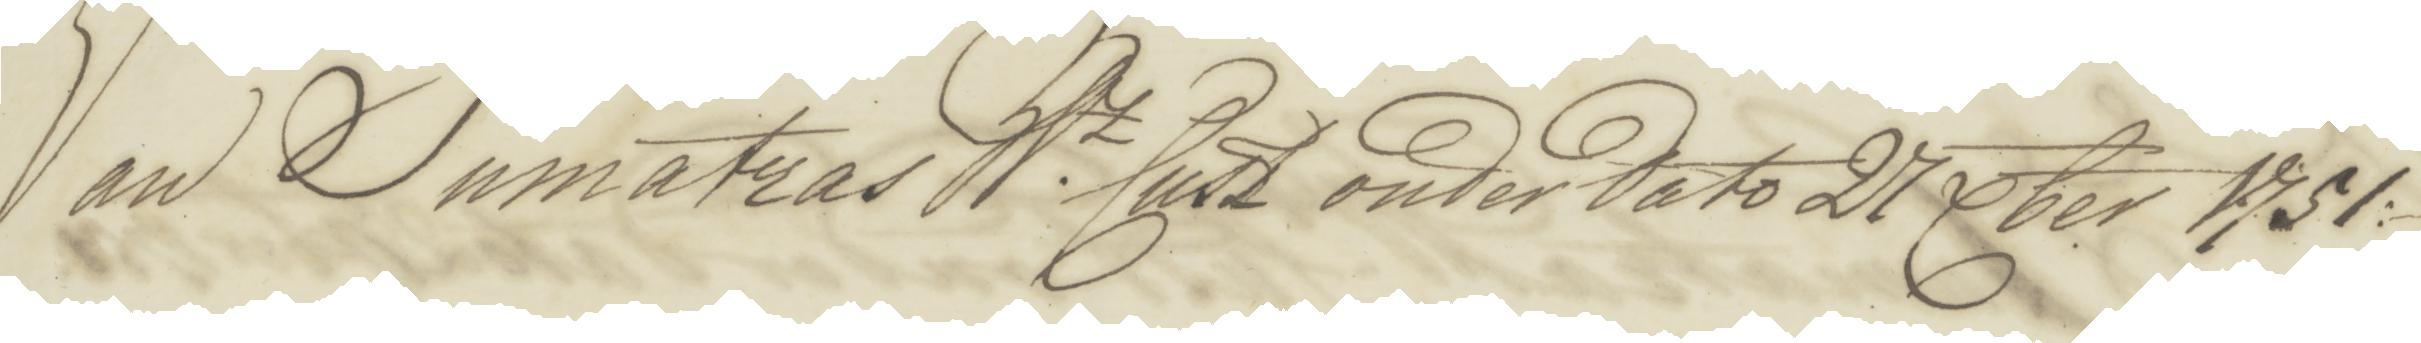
Van Sumatras W.t Cust onder dato 27 xber 1751:
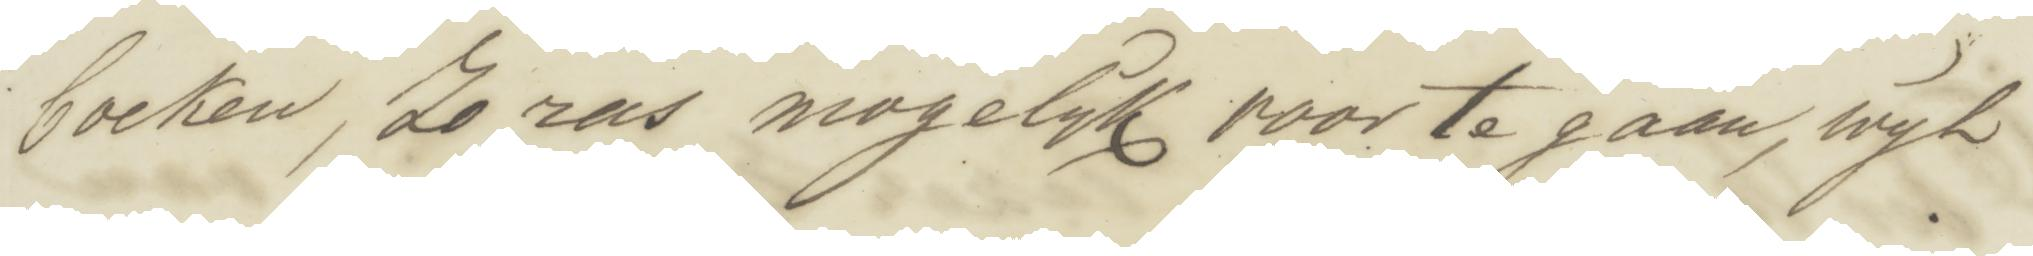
boeken, Zo ras mogelijk voor te gaan, wijl
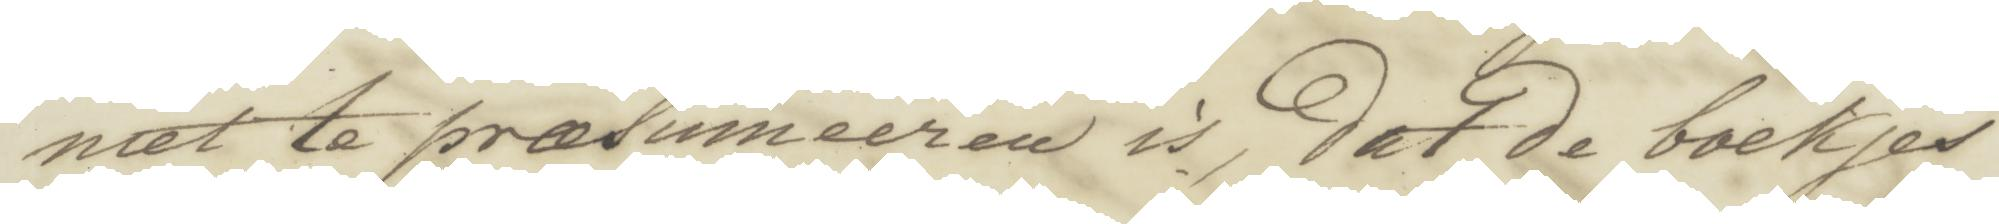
niet te preesumeeren is, dat de boekjes
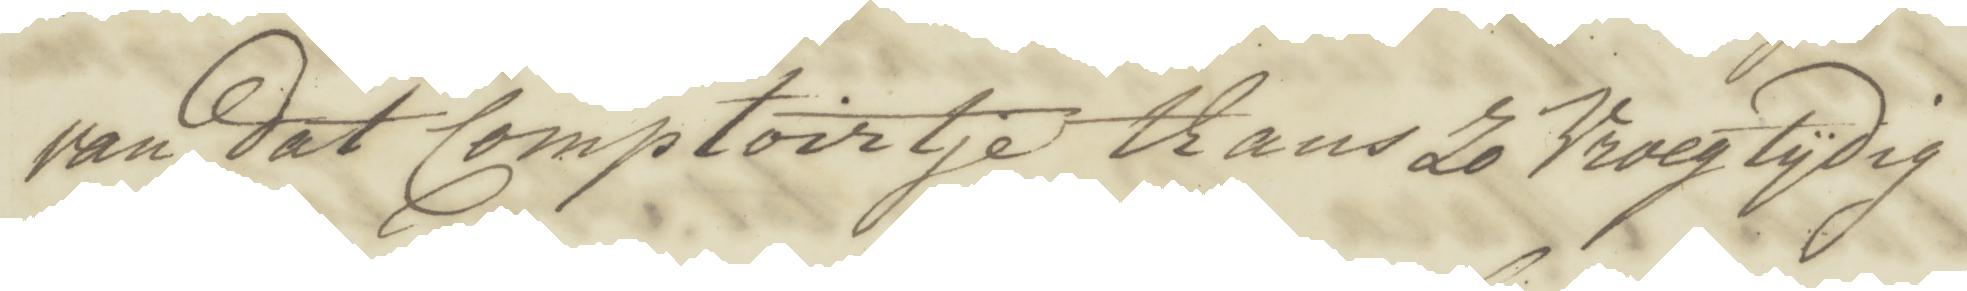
van dat Comptoirtje thans Zo Vroeg tijdig
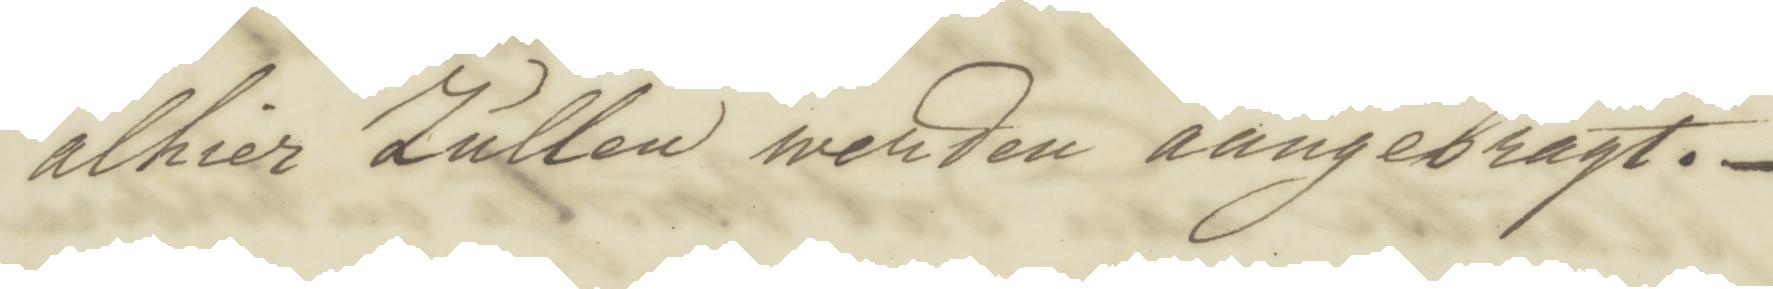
alhier Zullen werden aangebragt.
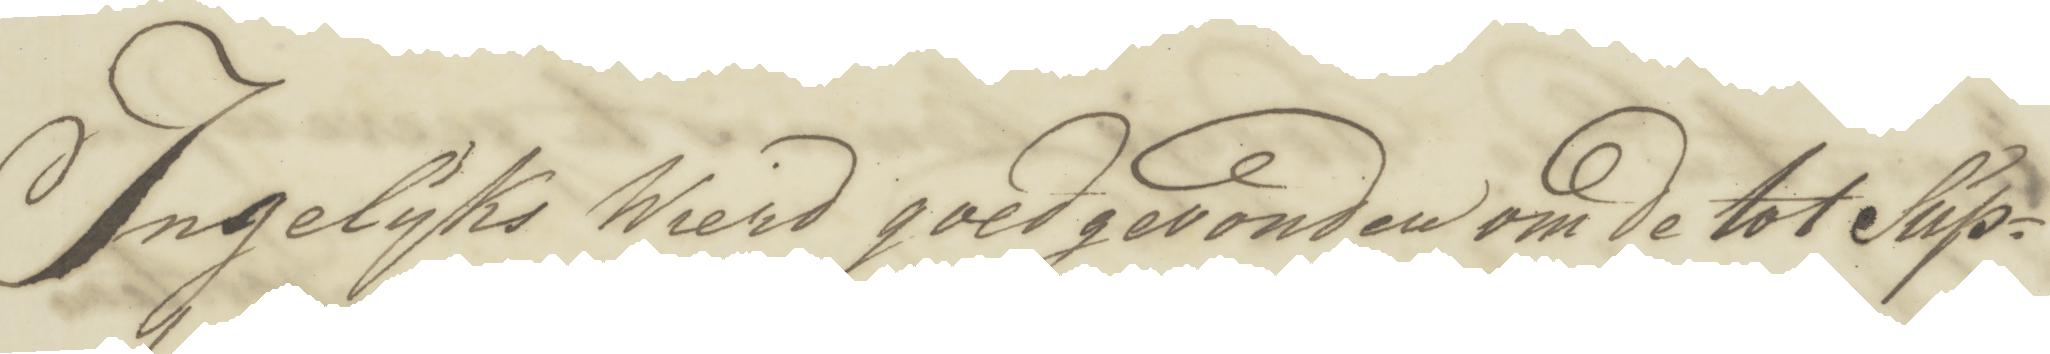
Ingelijks wierd goed gevonden om de tot Sup=
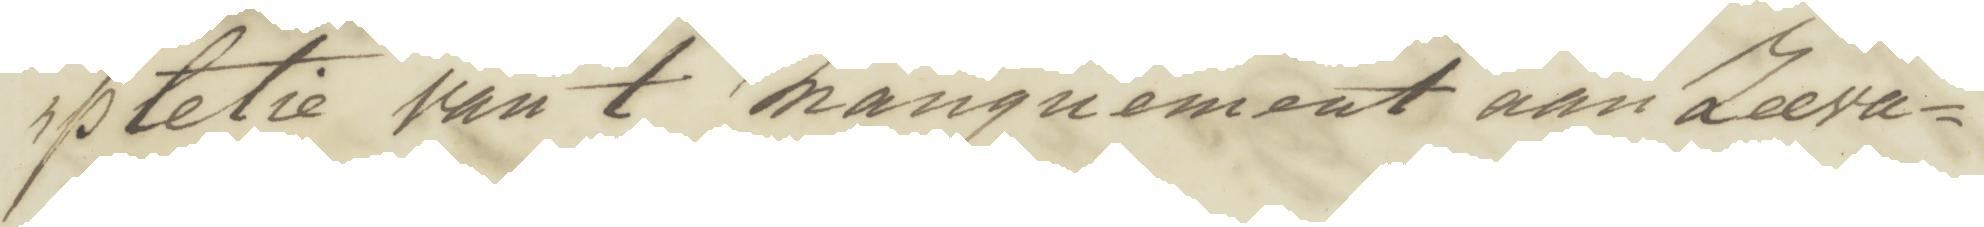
pletie van 't manquement aan Zeeva=
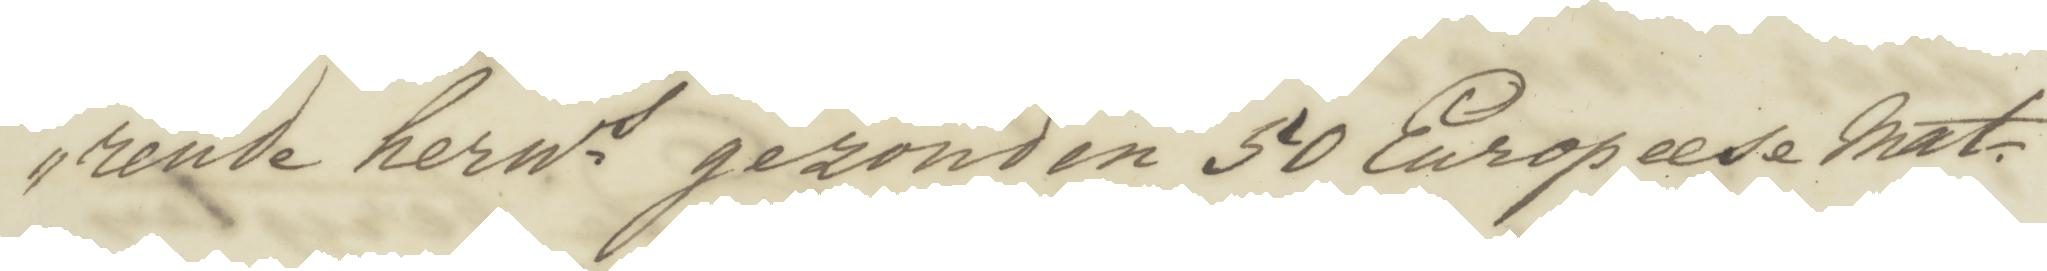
„rende herw:s gezonden 50 Europeese mat.
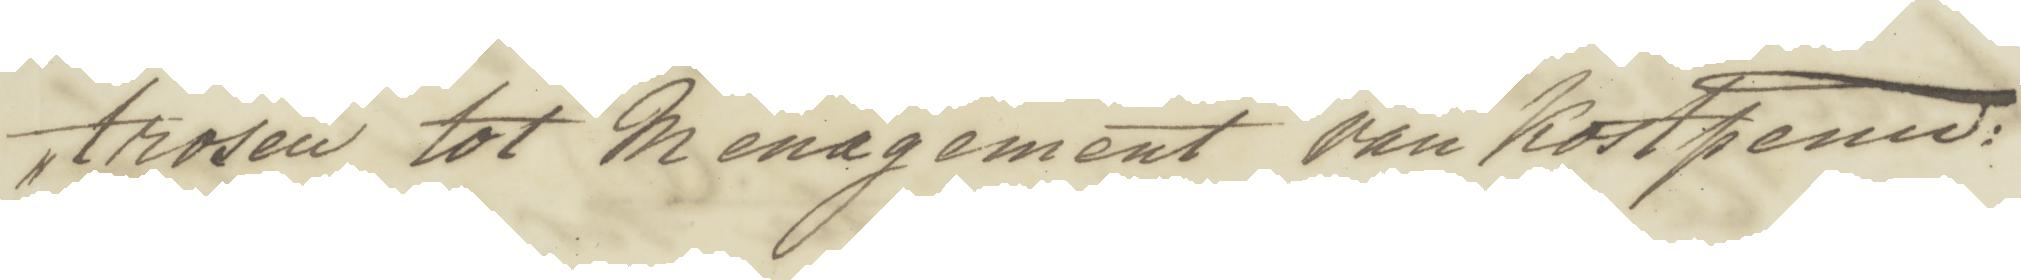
„trosen tot M enagement van kostpenn:
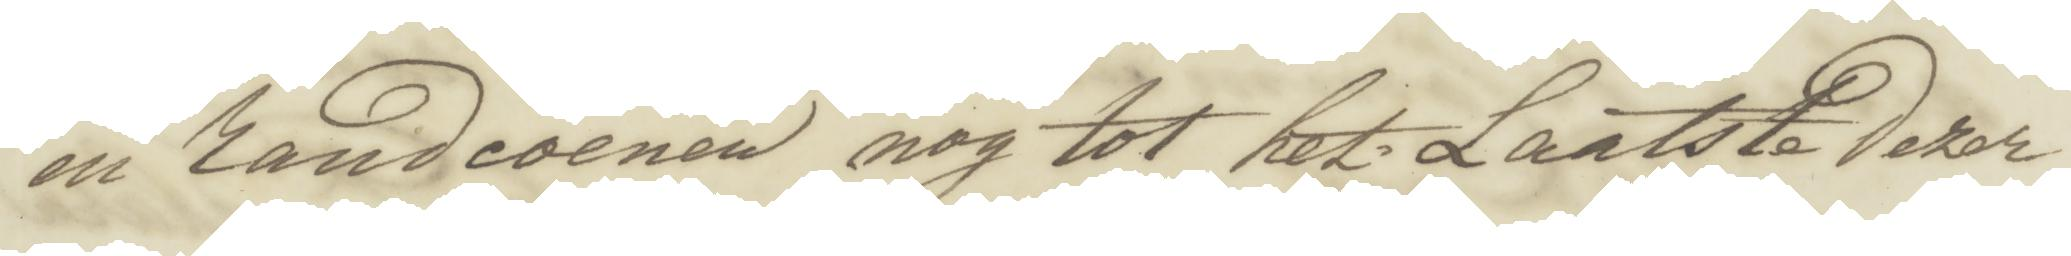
en randcoenen nog tot het Laatste dezer
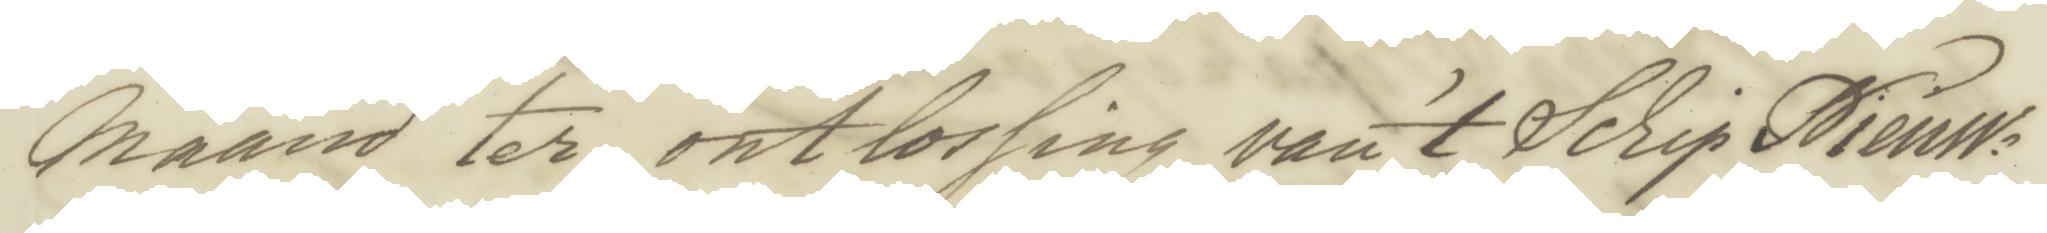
maand ter ontlossing van ’t schip Nieuw;
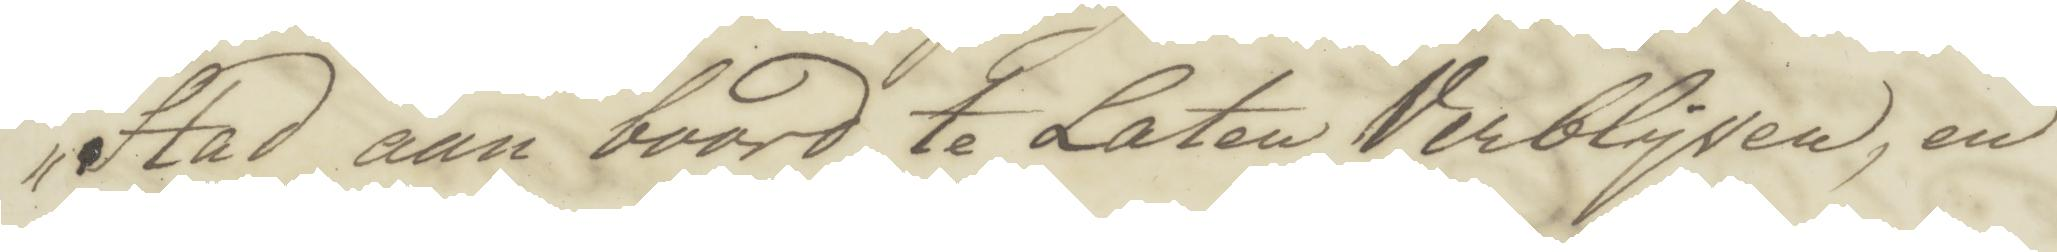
„Stad aan boord te laten Verblijven, en
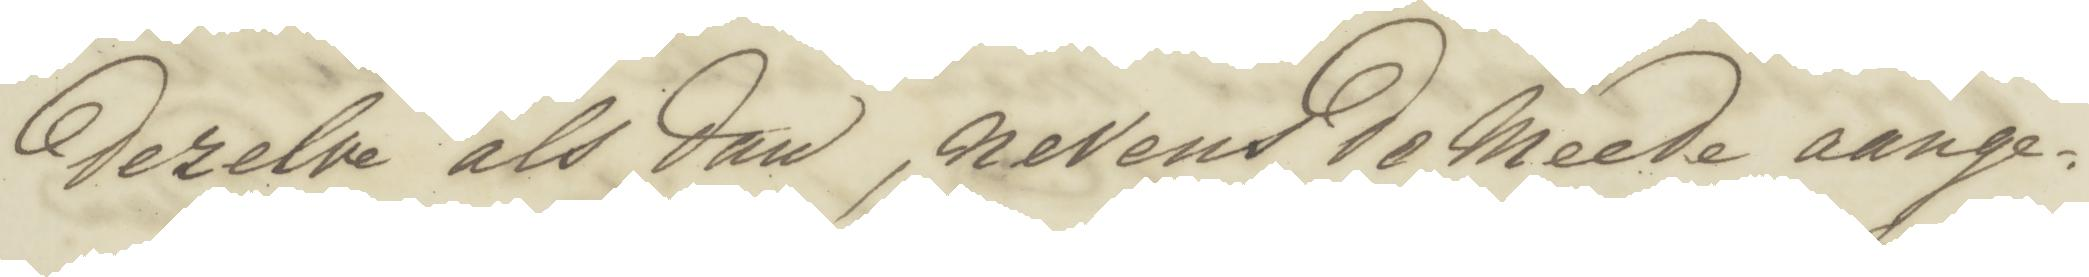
dezelve als dan, nevens de meede aange„
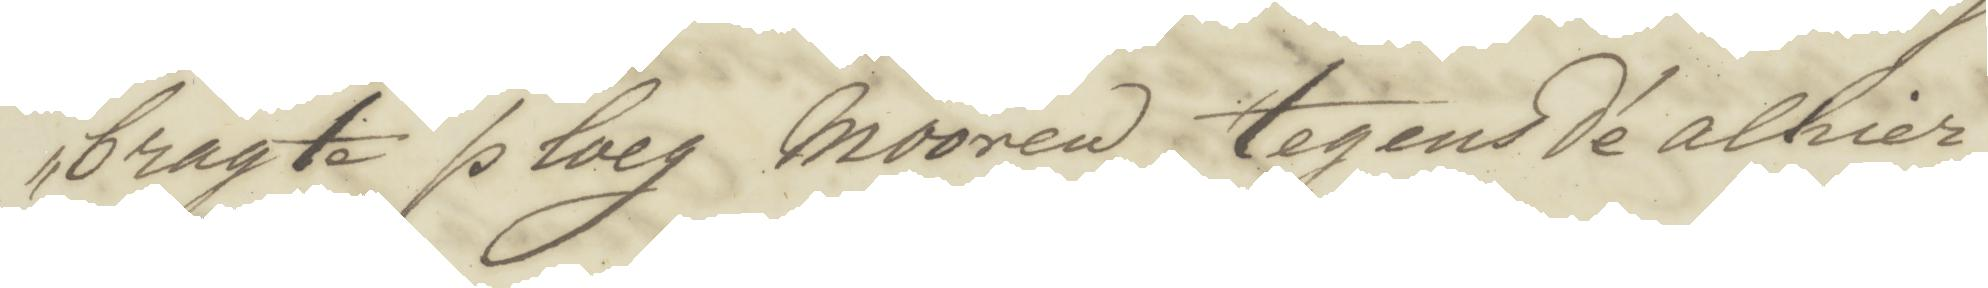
„bragte ploeg mooren, tegens de alhier
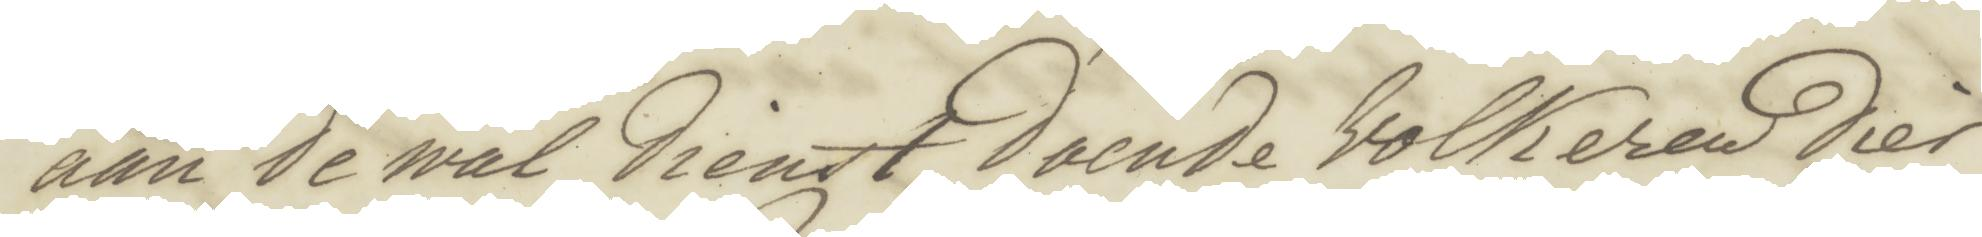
aan de wal dienst doende volkeren dier
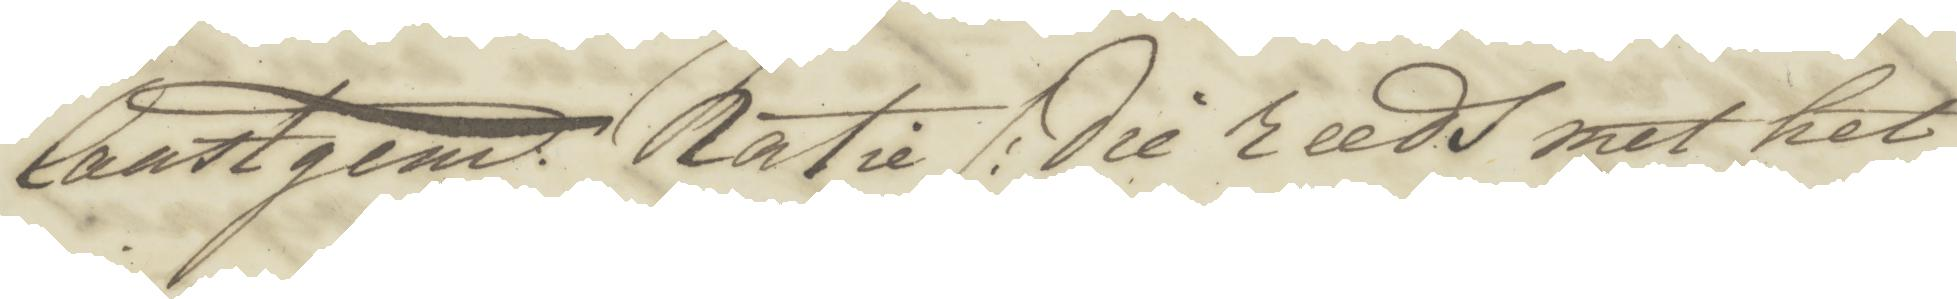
laastgem: Natie /:die reeds met het
